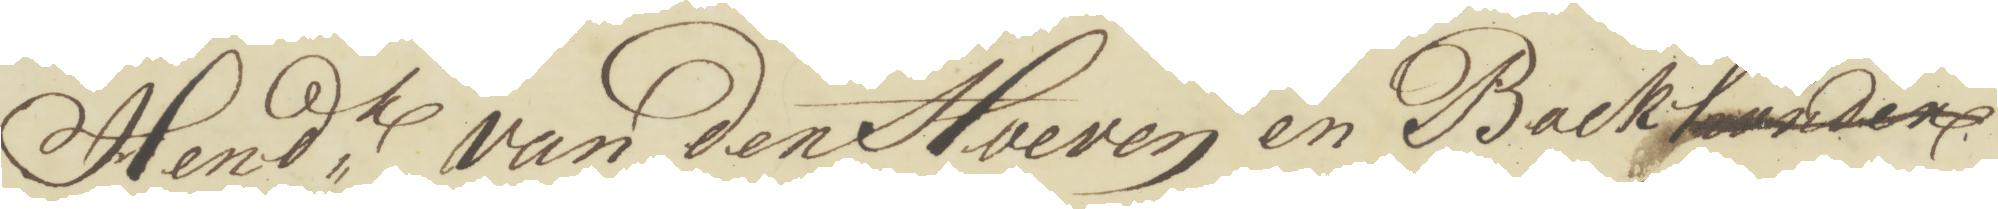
Hend„k van den Hoeven en Boekhouder
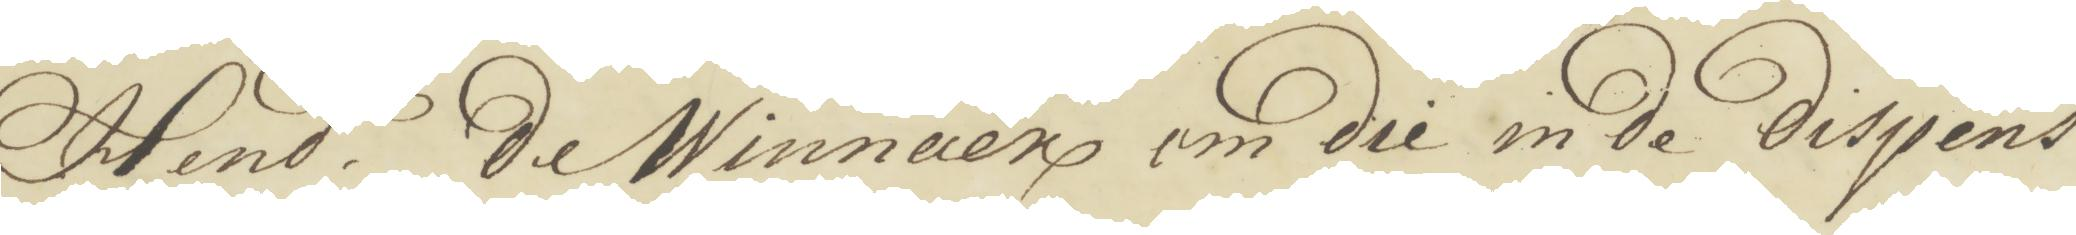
Hend.k de Winnaer om die in de dispens
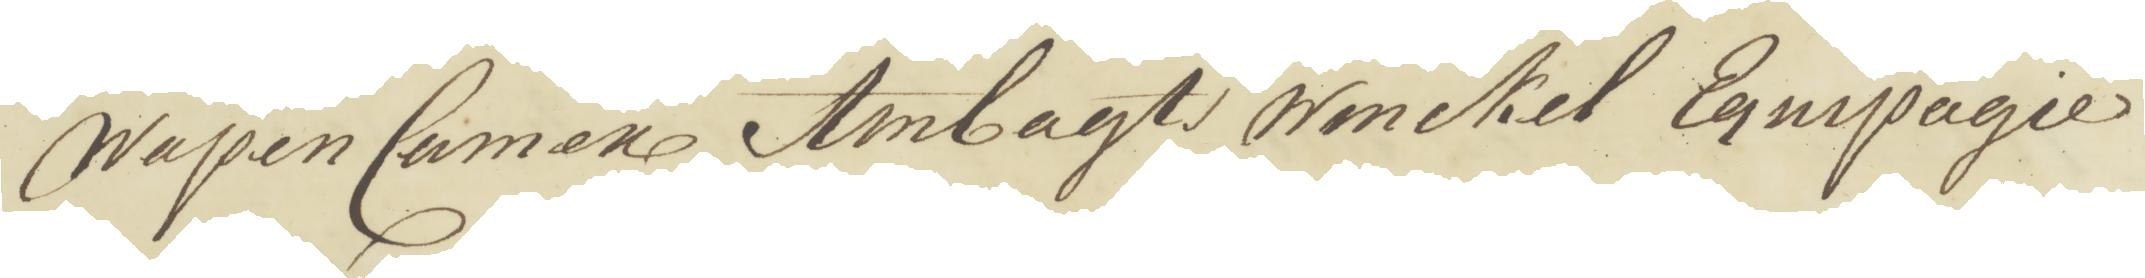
wapen camer Ambagts winckel Equipagie
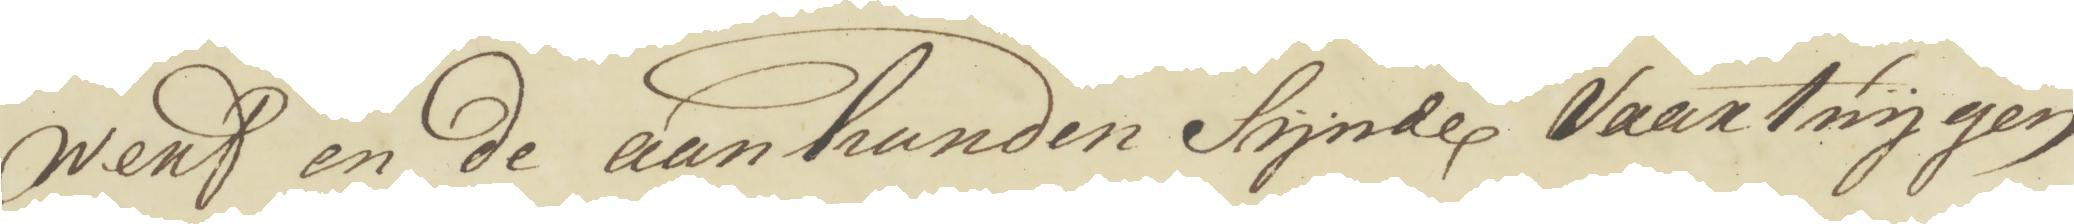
werf en de aanhanden sijnde vaartuijgen
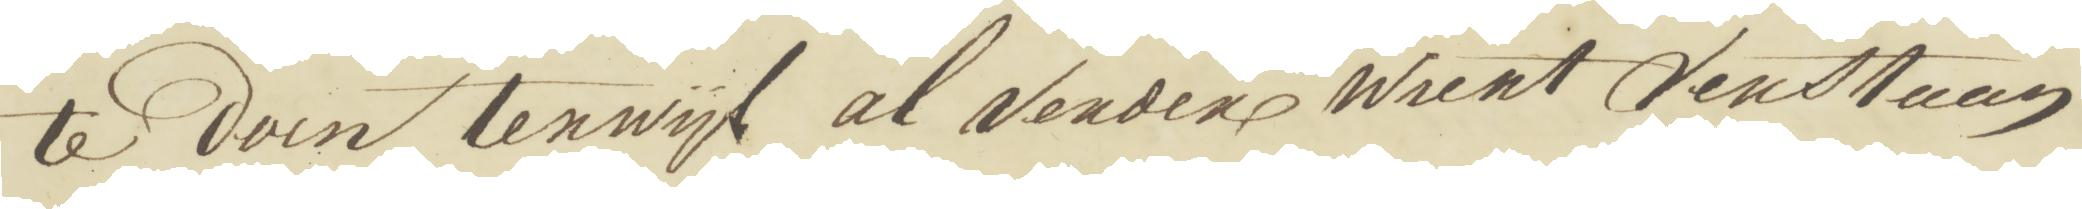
te doen terwijl al verder wiert verstaan
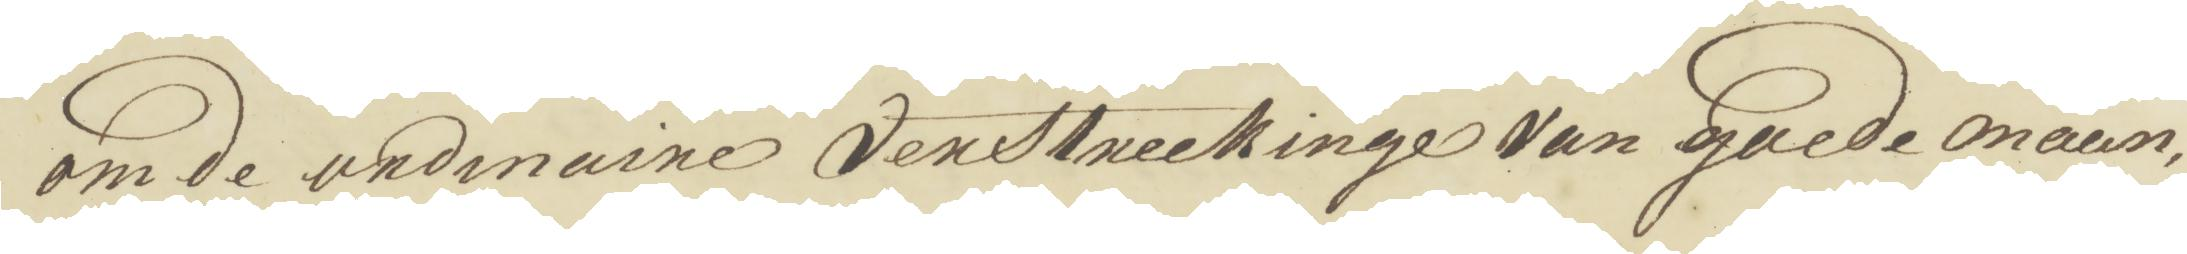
om de ordinaire verstreckinge van goede maan,
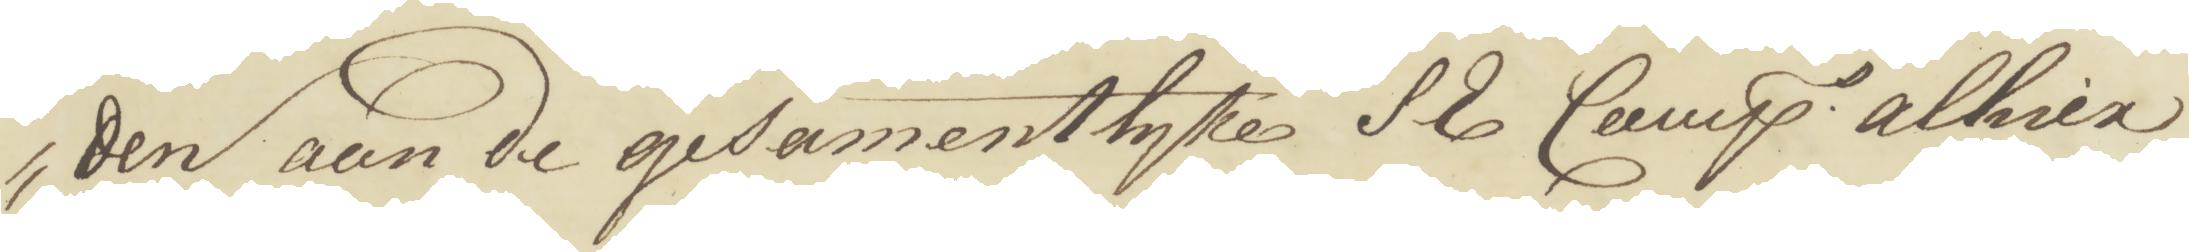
„den aan de gesamentlijke sE Comp.s alhier
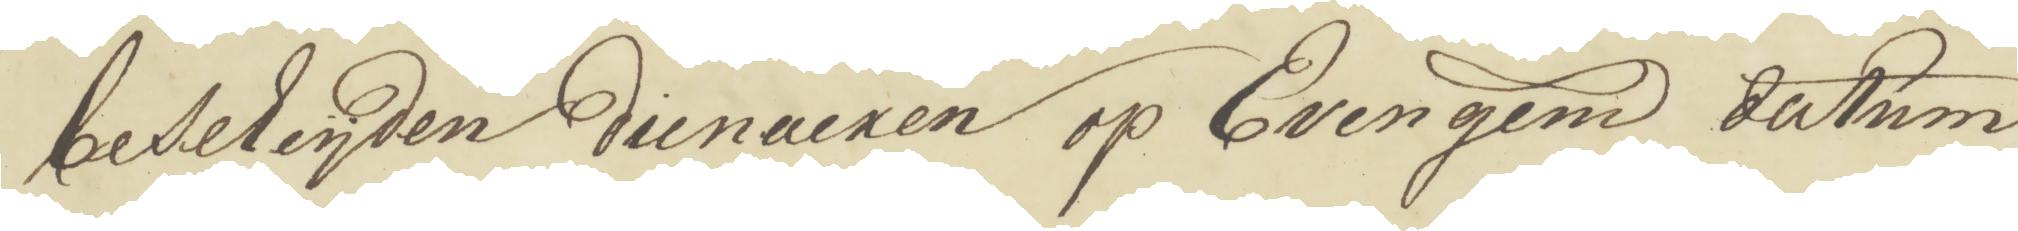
bescheijden dienaeren op Evengem datum
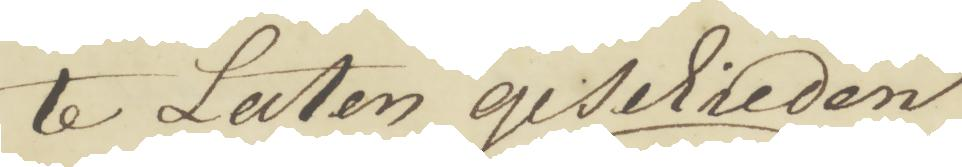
te laten geschieden
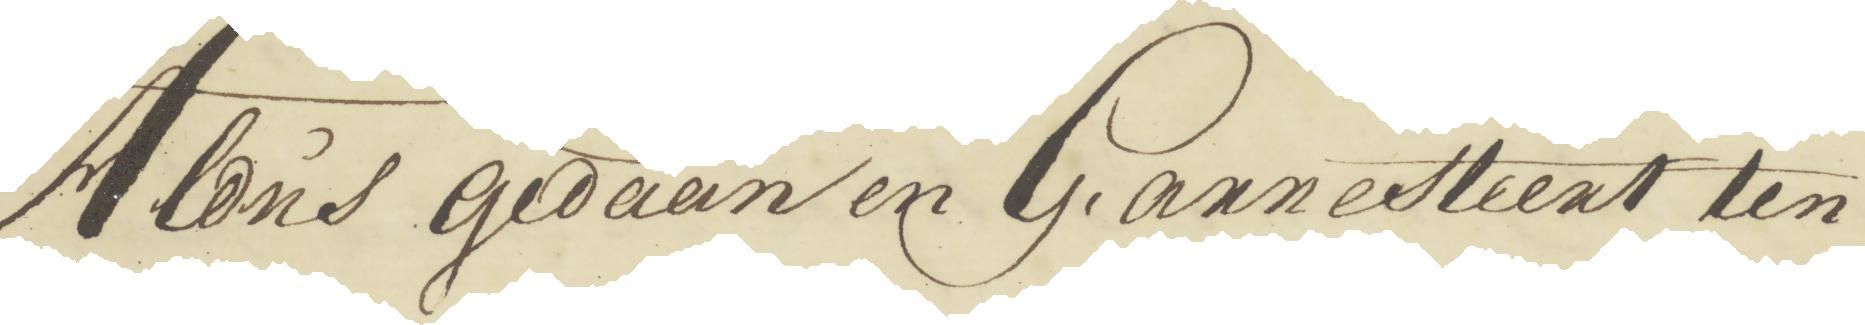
Aldus gedaan en G’arresteert ten
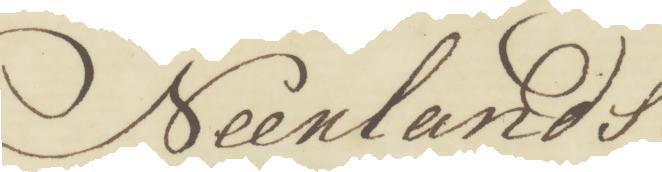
Neerlands
